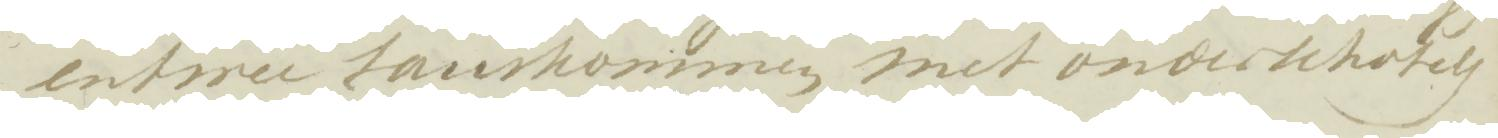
en twee sauskommen met onderschotels
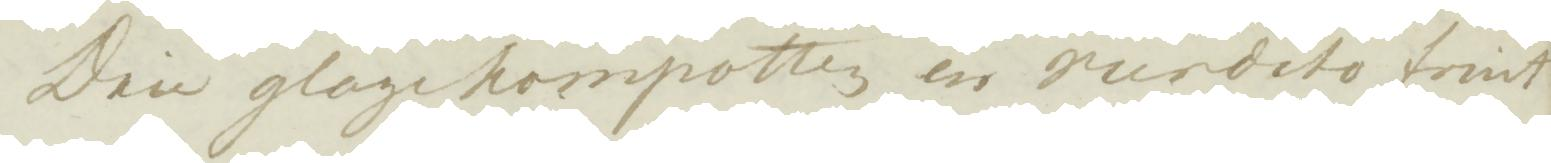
Drie glaze kompotten en vierdito fruit
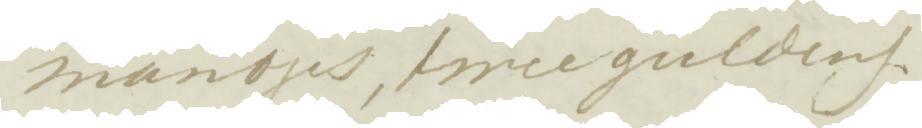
mandjes, twee guldens.
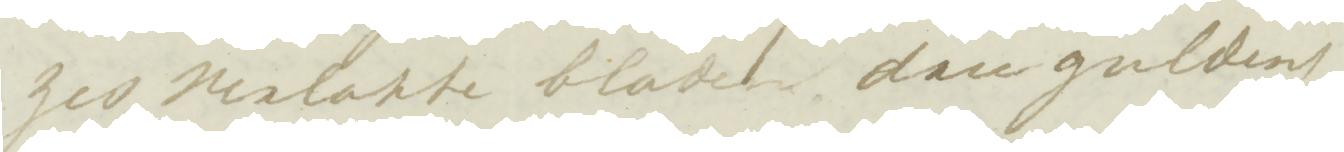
Zes verlakte bladen drie guldens
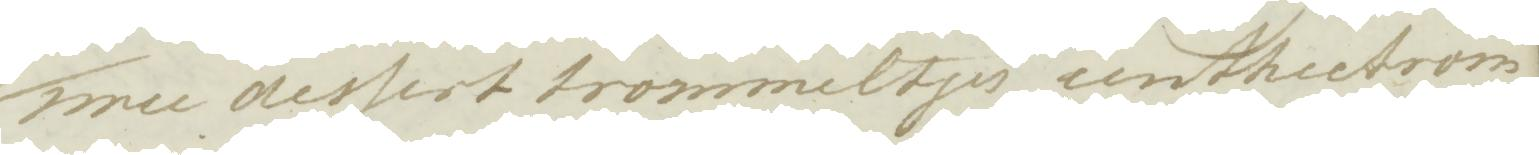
Twee dessert trommeltjes, een theetrom
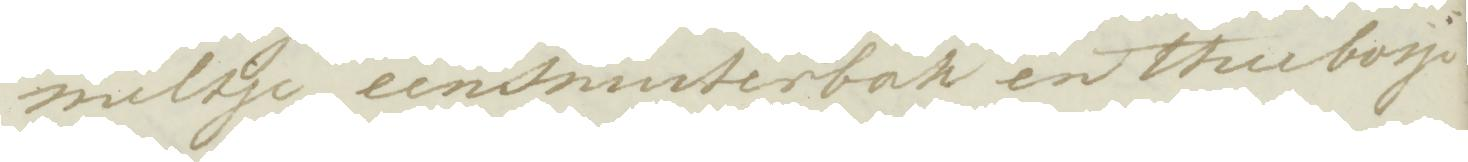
meltje, een snuiterbak en theebosje
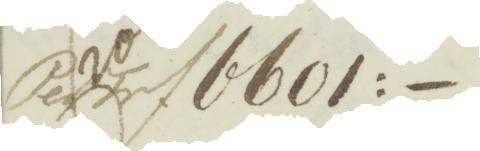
Per Trƒ ƒ6601:—
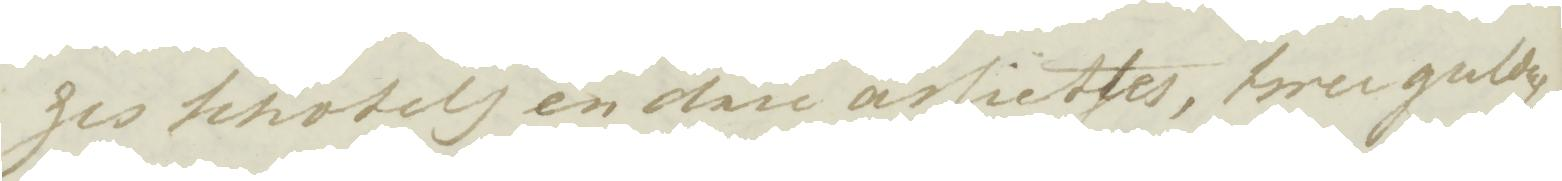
Zes schotels en drie assiettes, twee guldens
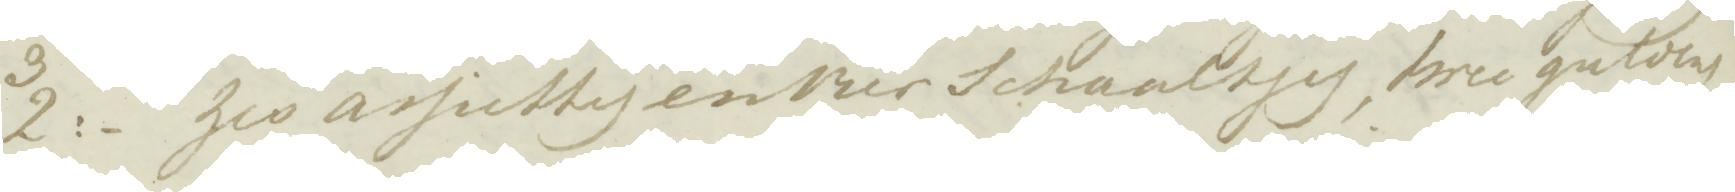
2 :- Zes assiettes en vier schaaltjes, twee guldens
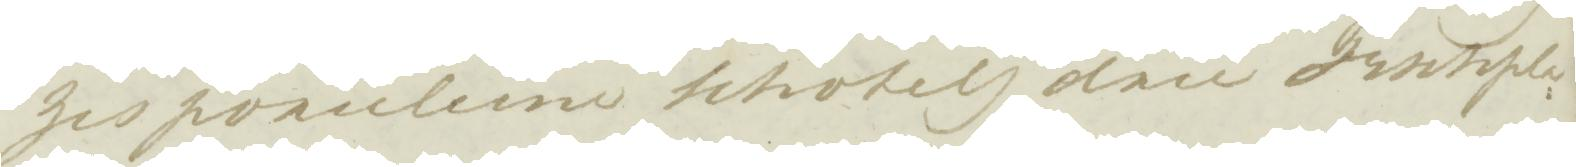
Zes porceleine schotels drie Vischpla:
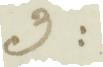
3 :
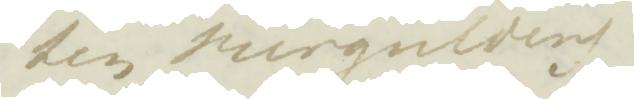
ten vierguldens
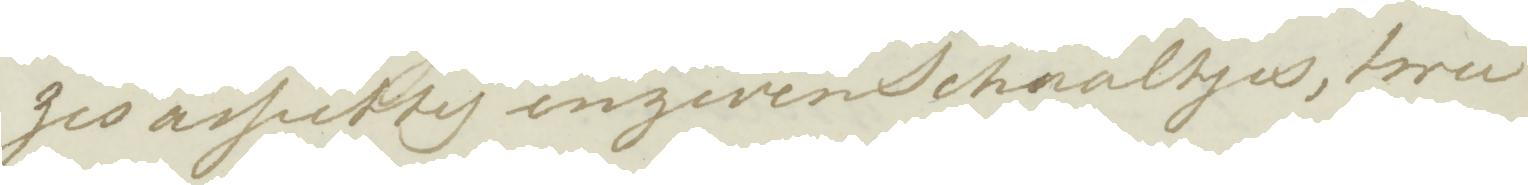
Zes assiettes enzevenschaaltjes, twee
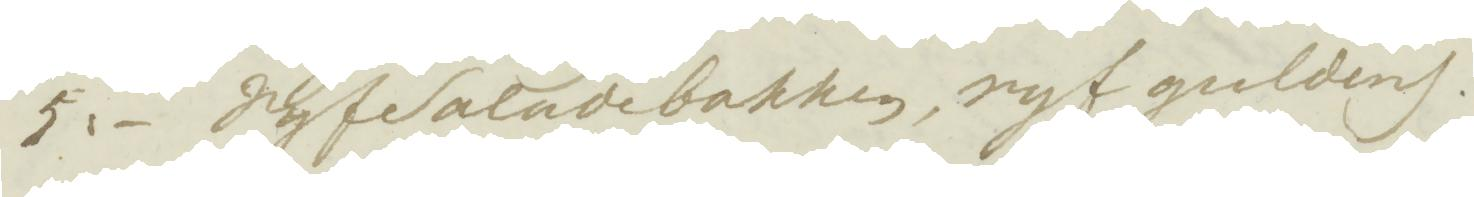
5: — Vyf saladebakken, vyf guldens.
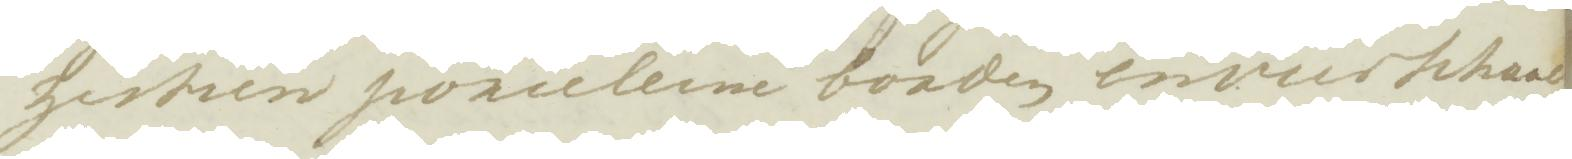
Zestien porceleine borden en vierschaal
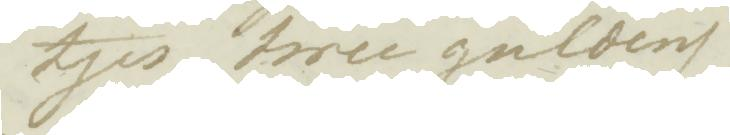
tjes, twee guldens
